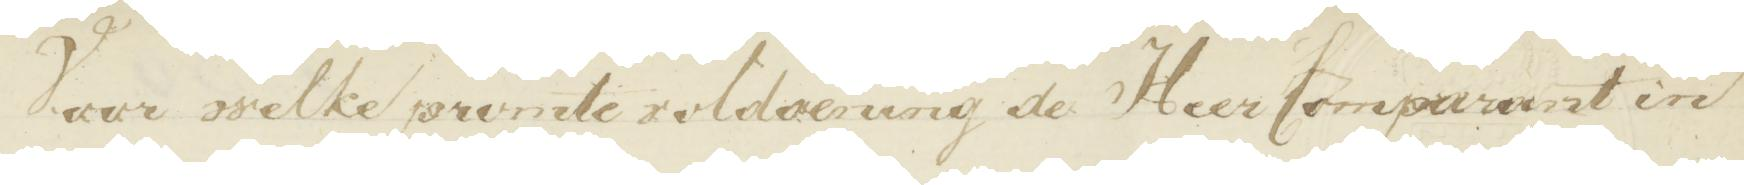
Voor welke promte voldoening de Heer Comparant in
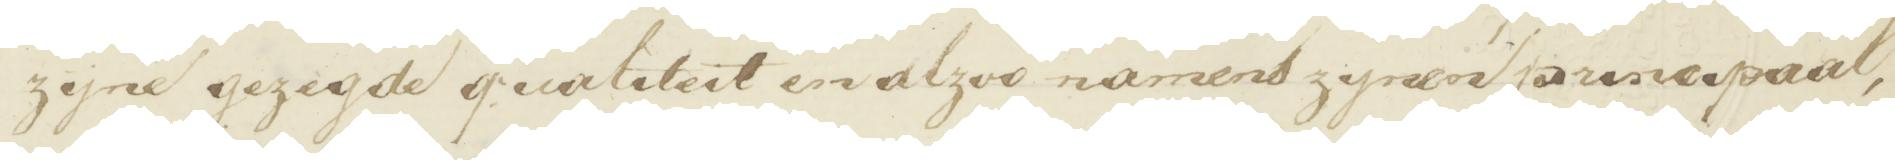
zijne gezegde qualiteit en alzoo namens zynen principaal,
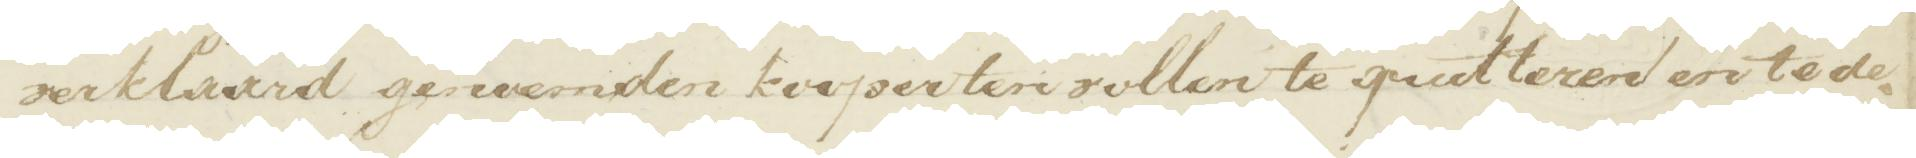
verklaard genoemden kooper ten vollen te quitteren en te de„
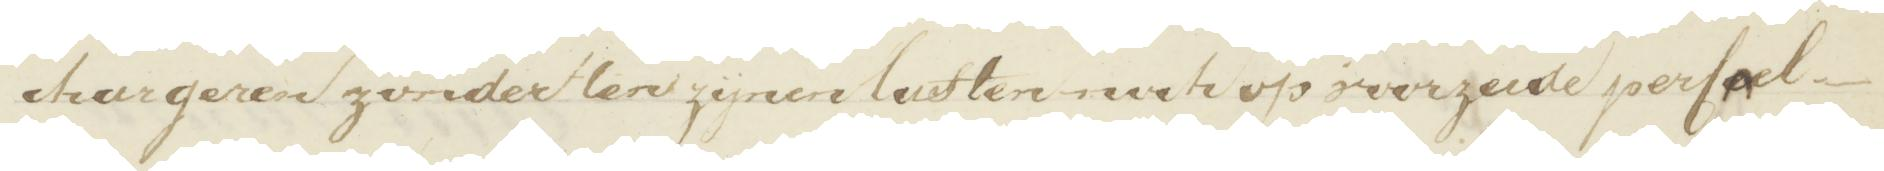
chargeren zonder ten zijnen lasten noch op voorzeide perceel-
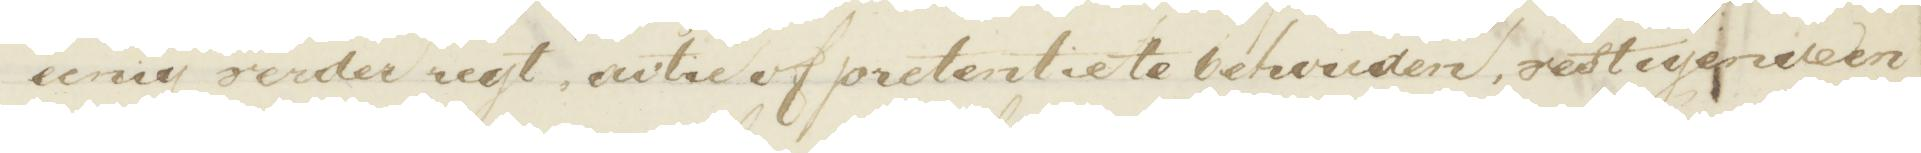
eenig verder regt, actie of pretentie te behouden, vestigende en
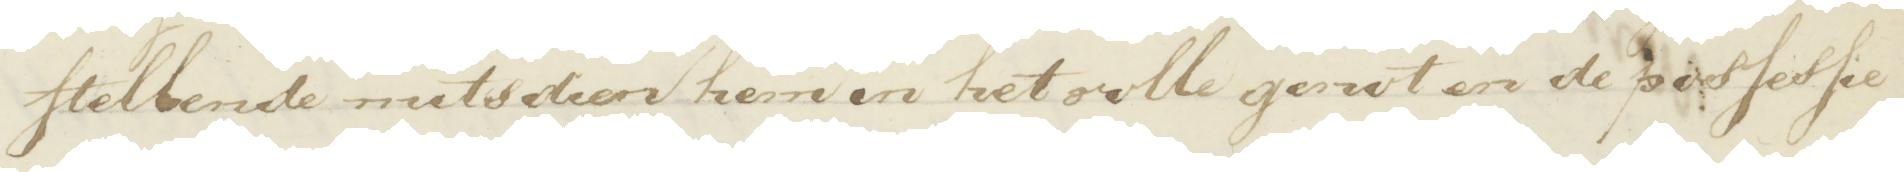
stellende mitsdien hem in het volle genot en de possessie
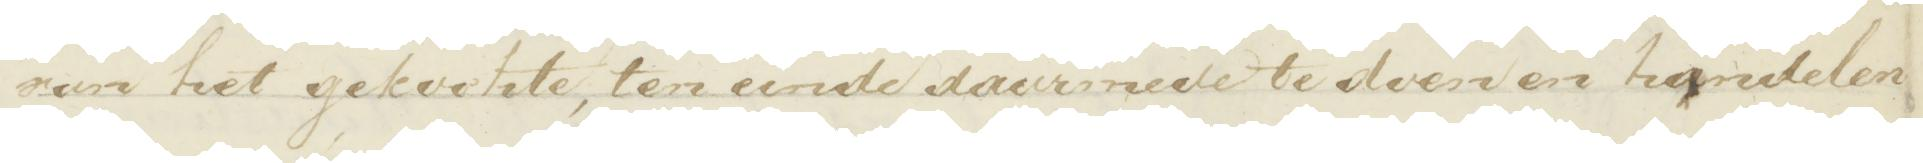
van het gekochte, ten einde daarmede te doen en handelen
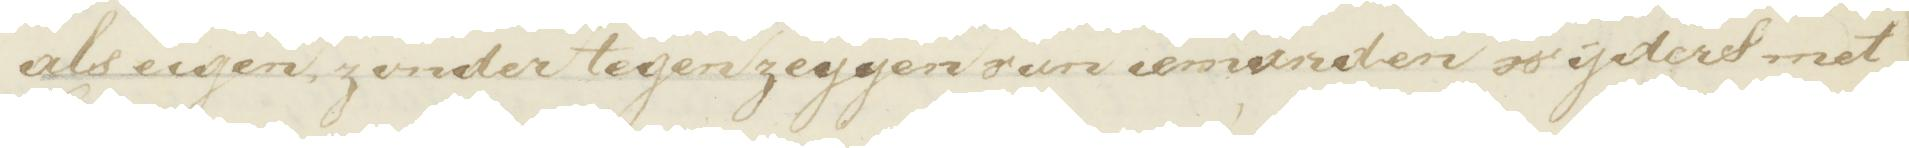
als eigen, zonder tegenzeggen van iemanden wijders met
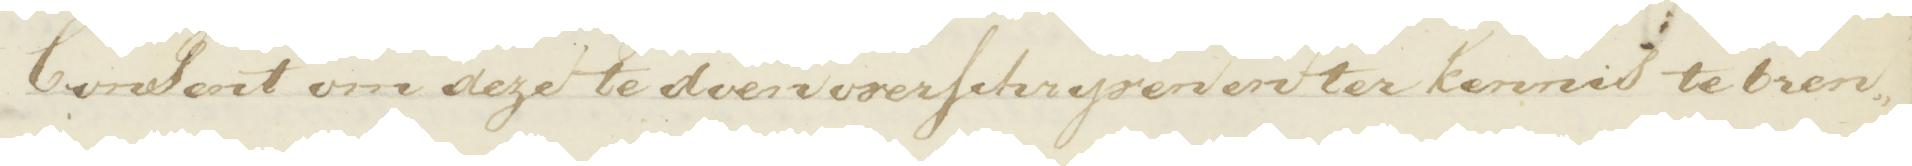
Consent om deze te doen overschryven en ter kennis te bren„
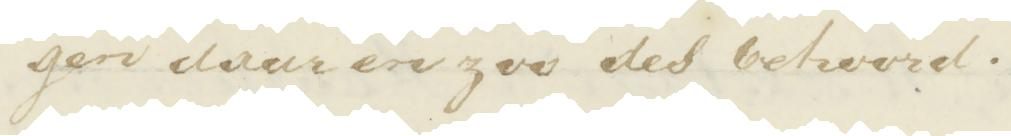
gen daar en zoo des behoord.
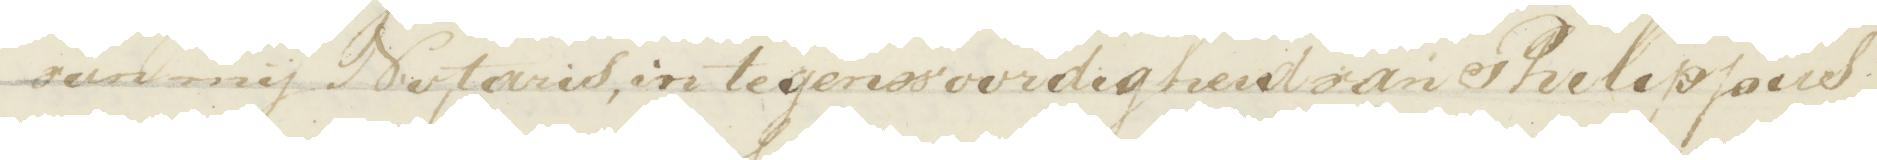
van mij Notaris, in tegenwoordigheid van Philippus.
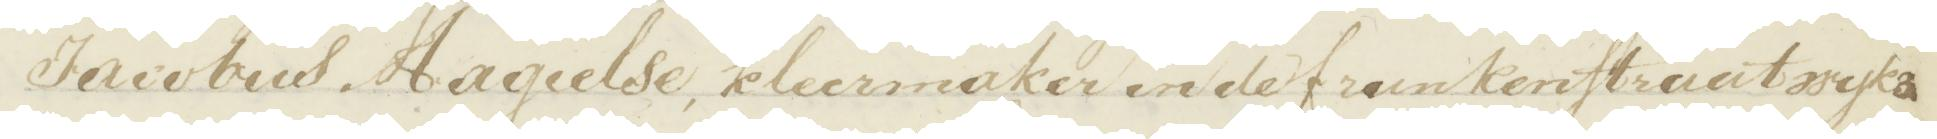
Jacobus Magielse, kleermaker en de frankenstraat wyk 3
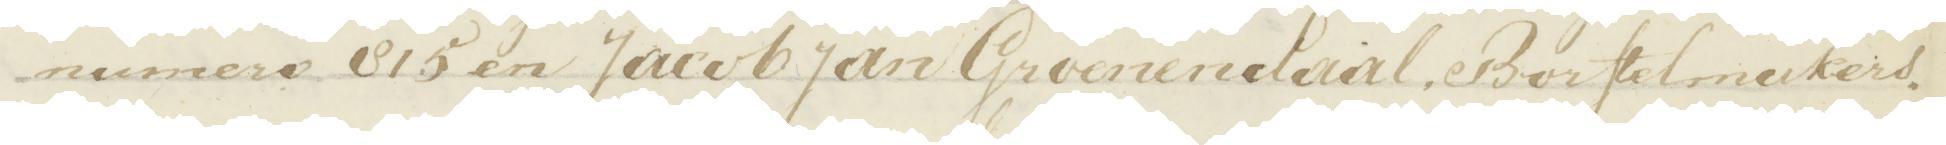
numero 815 en Jacob Jan Groenendaal, Borstelmakers
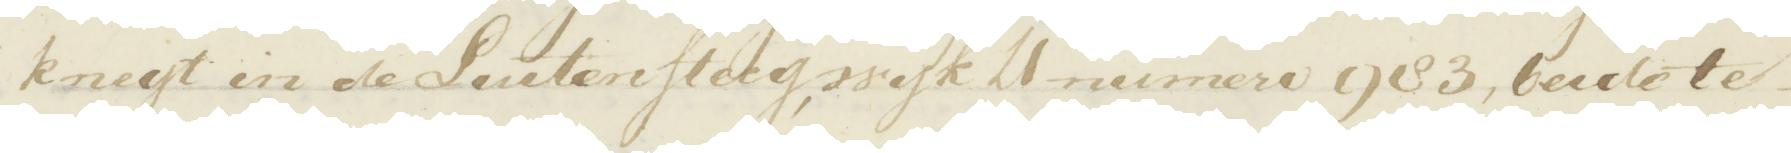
knegt in de Luitensteeg wyk 4 numero 983, beide te
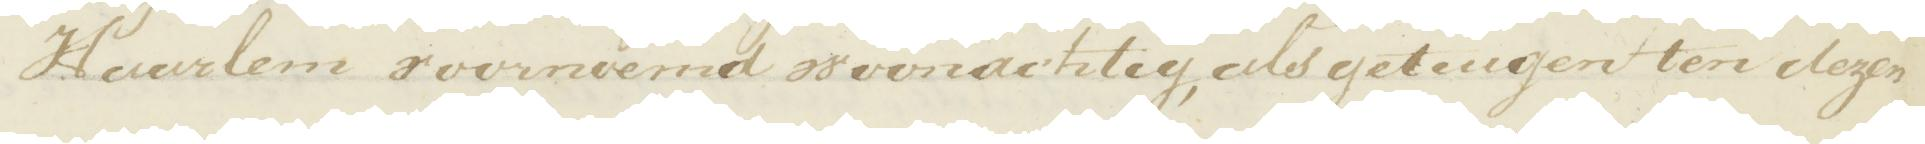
Haarlem voornoemd woonachtig, als getuigen ten dezen
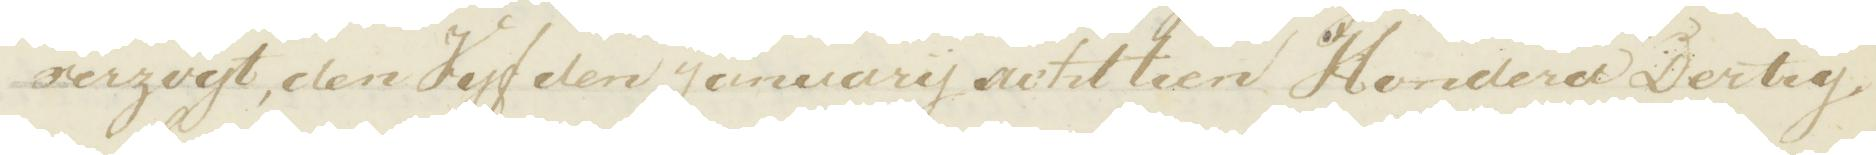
verzogt, den Vyfden Januarij achttien Honderd Dertig,
